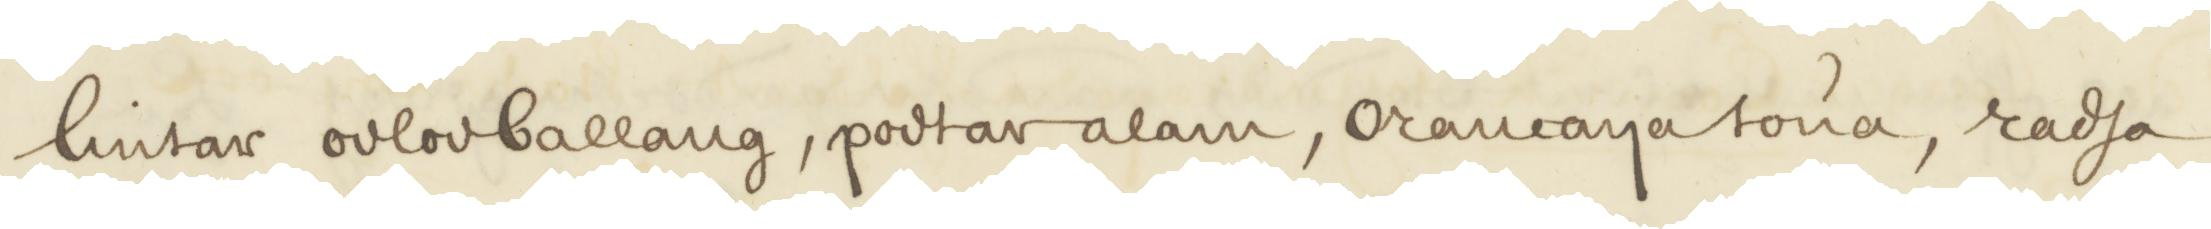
lintar oeloeballang, poetar alam, orancaya toua, radja
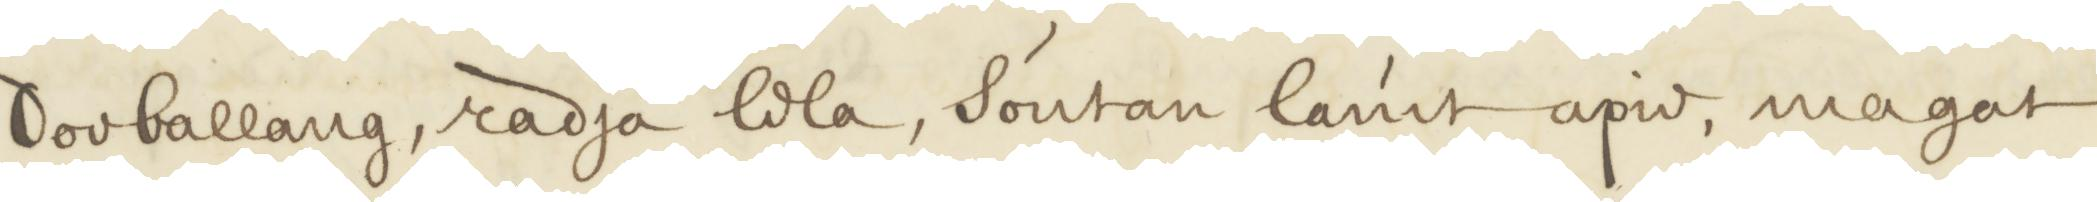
doeballang, radja lela, soutan lauit apie, magat
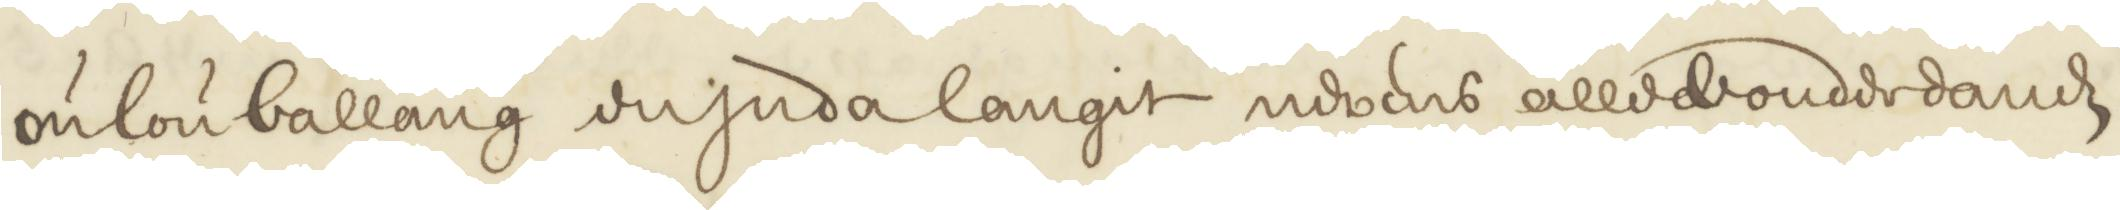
oulouballang en jndalangit nevers alle de onderdanen
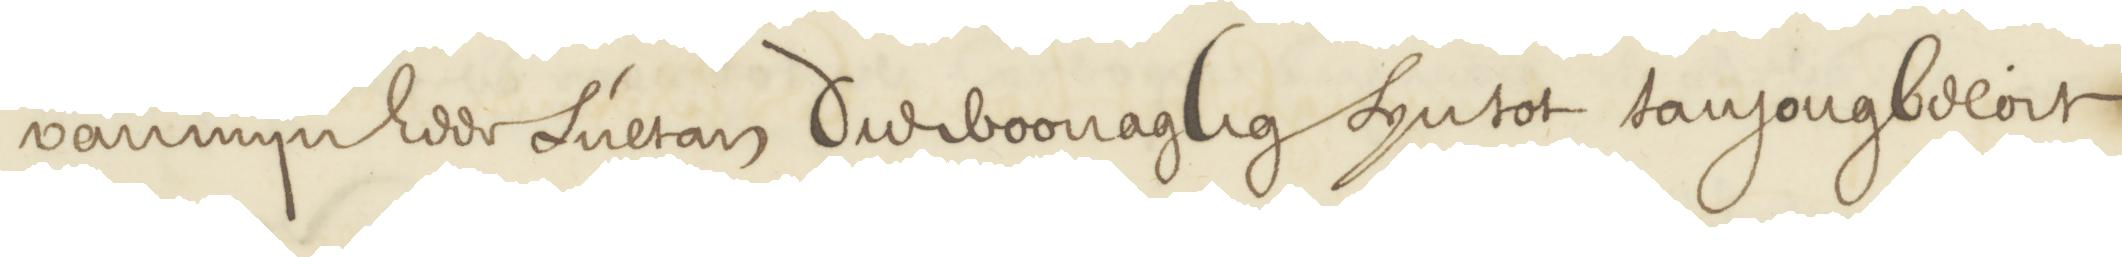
van mijn heer sultan die woonagtig syn tot tanjongbeloit
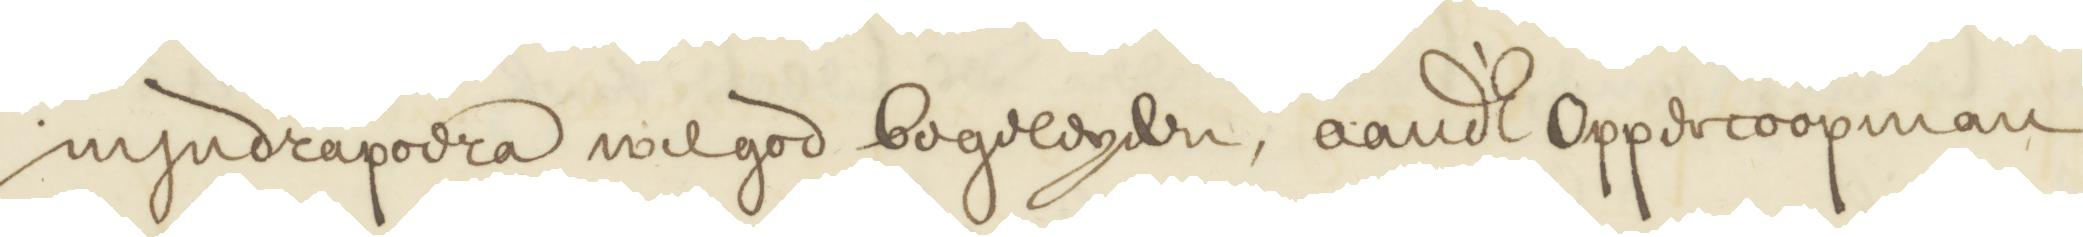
in jndrapoera wil god begeleyden, aan d'E Oppercoopman
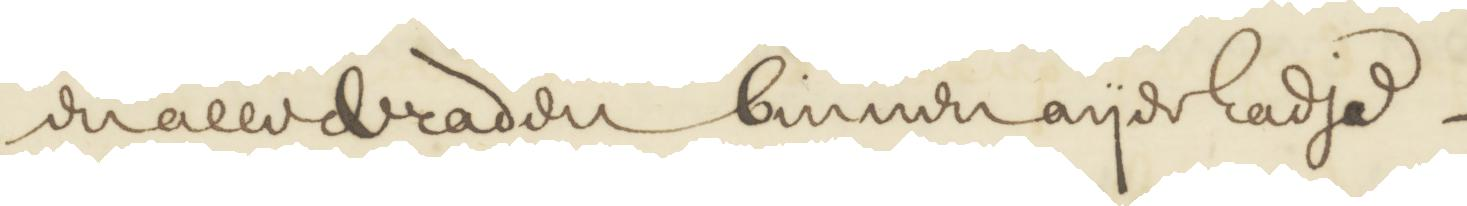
en alle de raden binnen aijerhadje
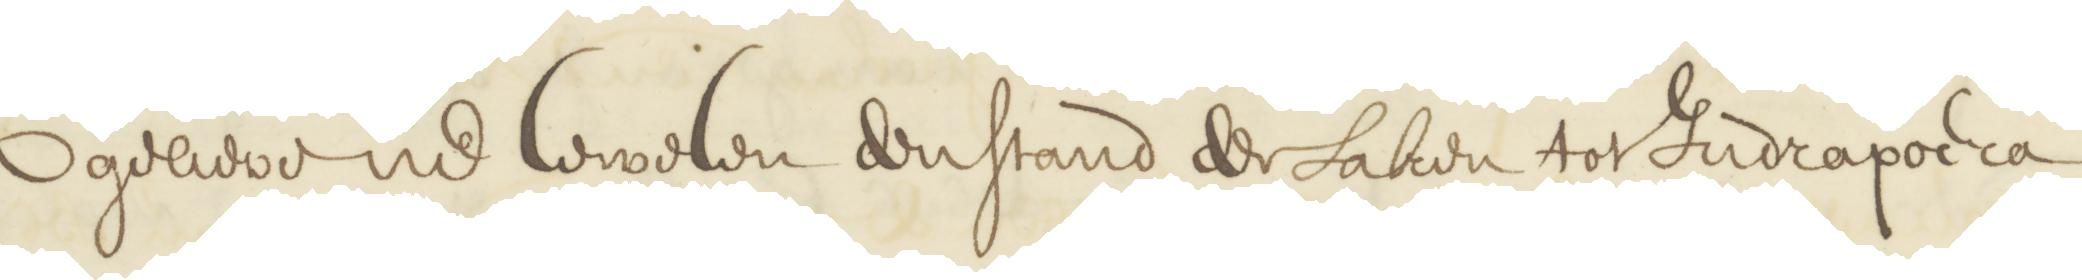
T gelieve ue teweten den stand der saken tot Indrapoera
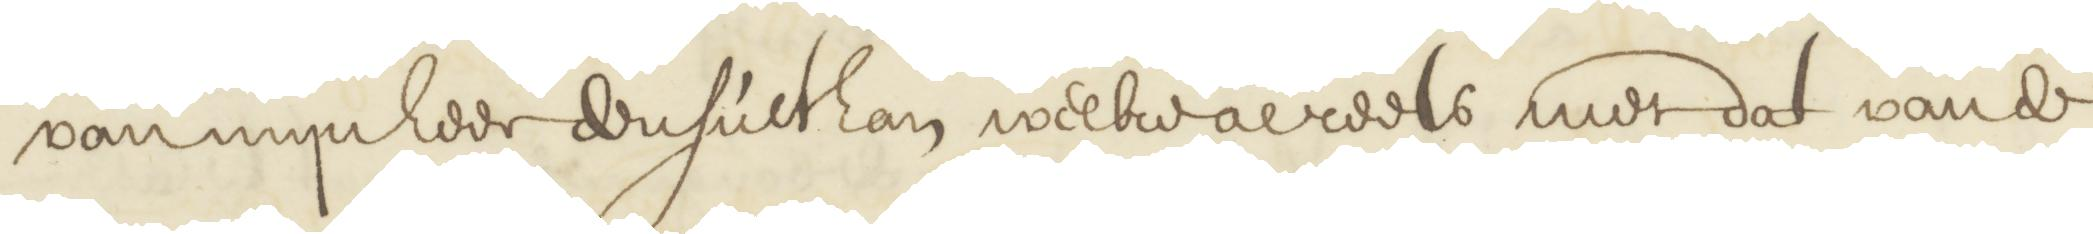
van myn heer den sulthan welke alreets met dat van de
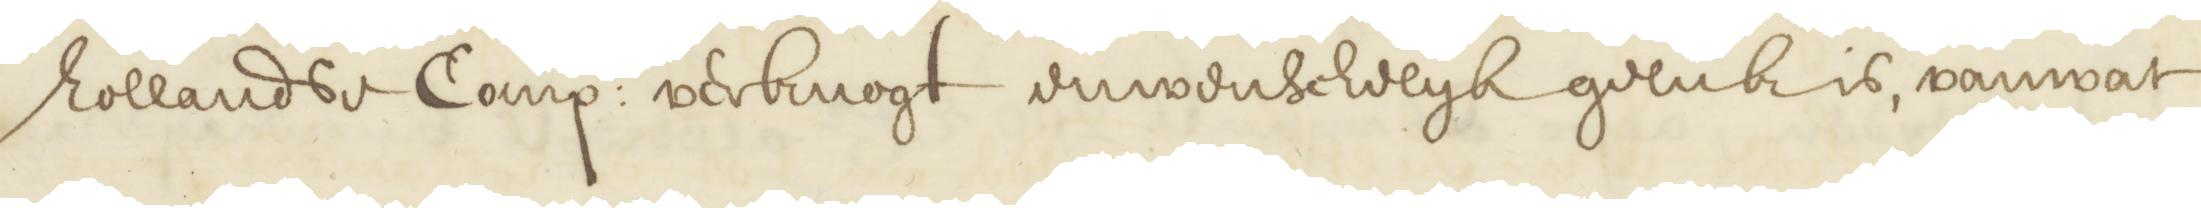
hollandse Comp:e verknogt en wenschelijk geluk is, van wat
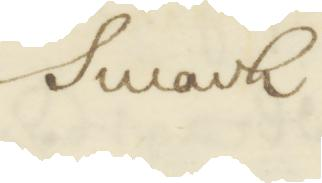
smaek
